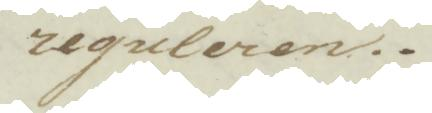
reguleren.
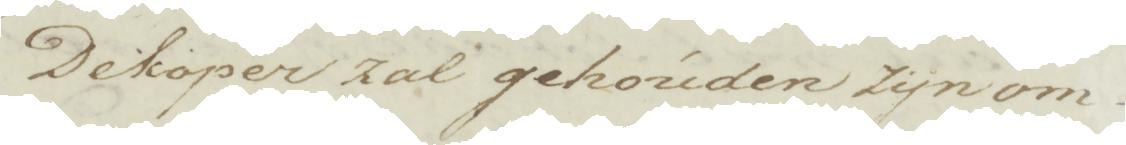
De koper zal gehouden zijn om
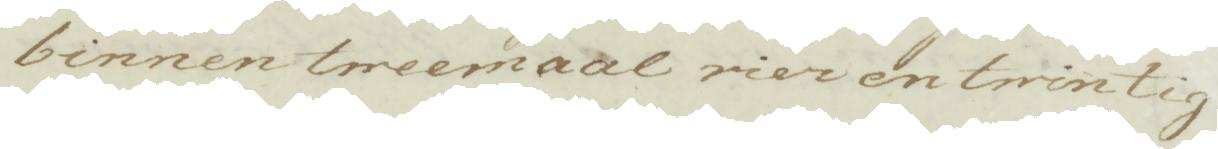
binnen tweemaal vier en twintig
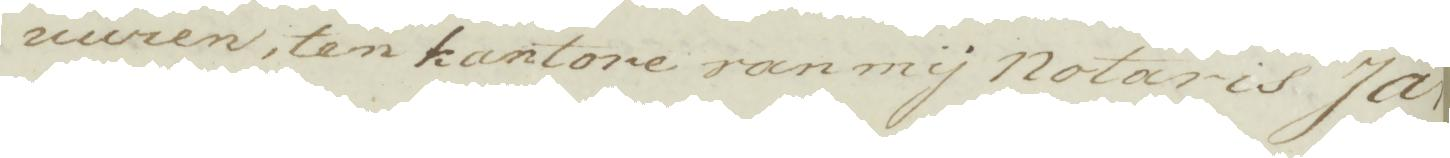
uuren, ten kantore van mij notaris Jan
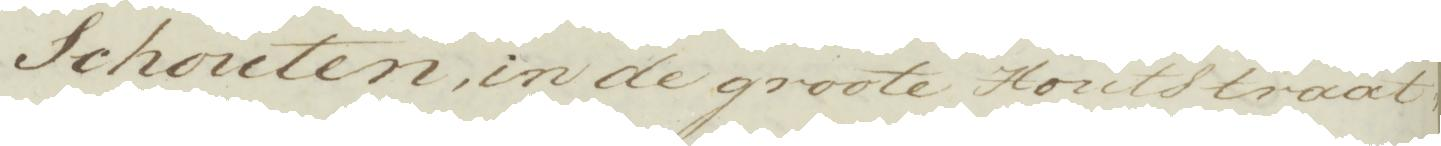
Schouten, in de groote Houtstraat
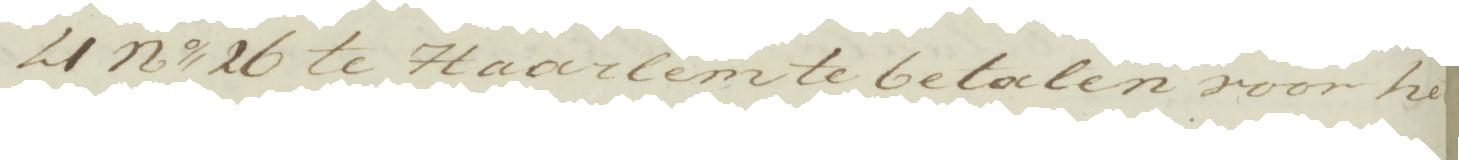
4 n=o 26 te Haarlem te betalen voor he
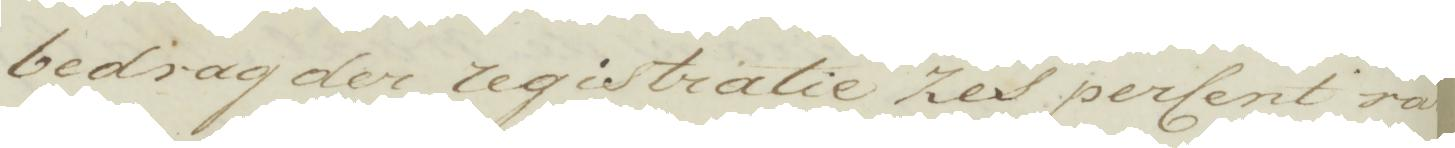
bedrag der registratie zes perCent va
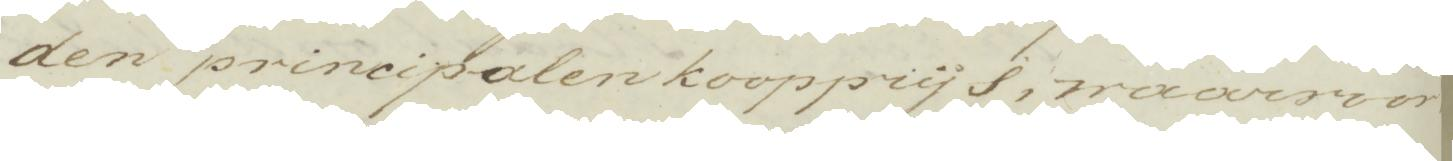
den principalen koopprijs, waarvoor
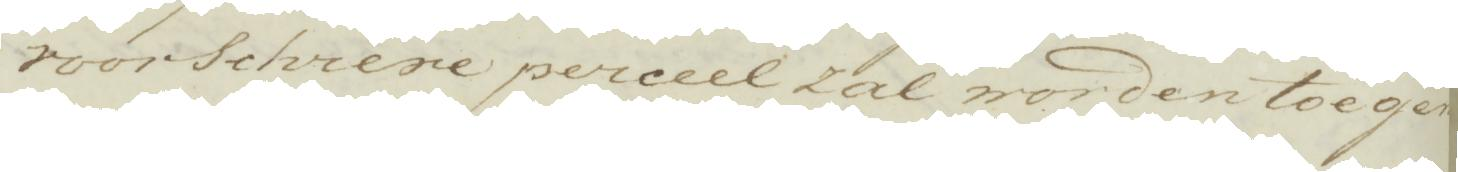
voorschreve perceel zal worden toege
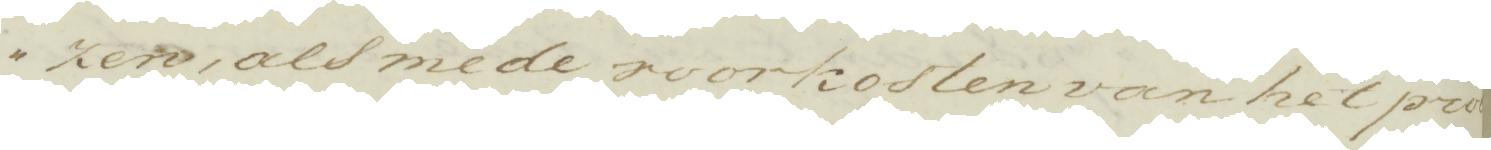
„ zen, als mede voor kosten van het pro
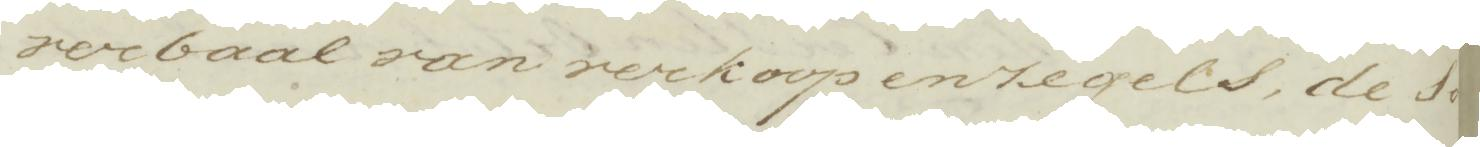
verbaal van verkoop en zegels, de so
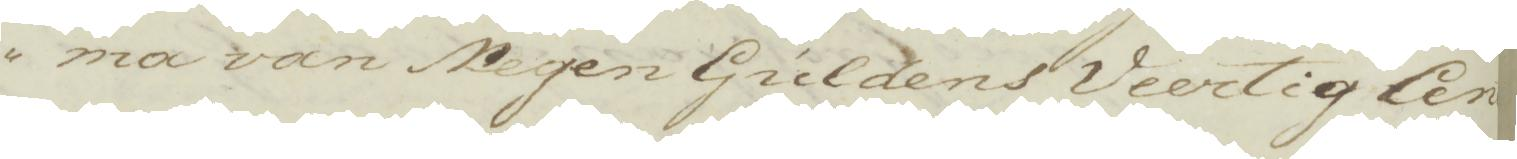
„ma van Negen Guldens Veertig Cen
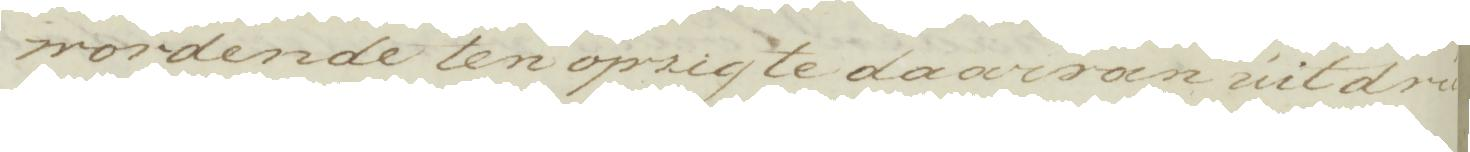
wordende ten opzigte daarvan uitdru
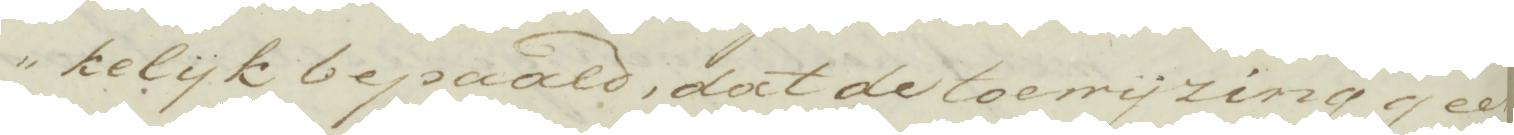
„ kelijk bepaald, dat de toewijzing gee
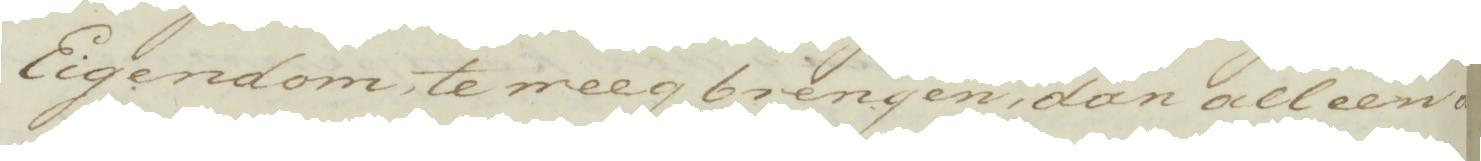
Eigendom, te weeg brengen, dan alleen o
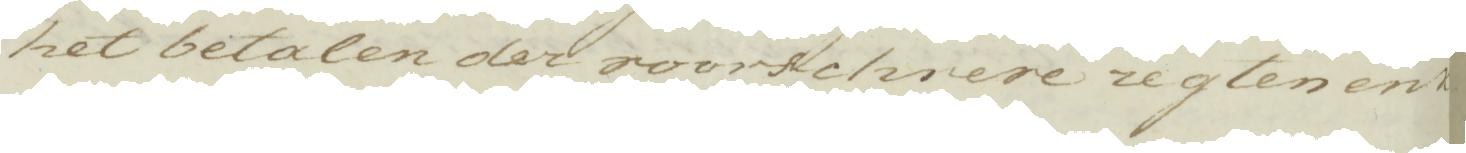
het betalen der voorschreve regten enz
